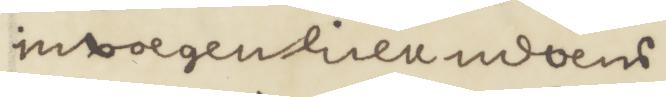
involgen hier nevens
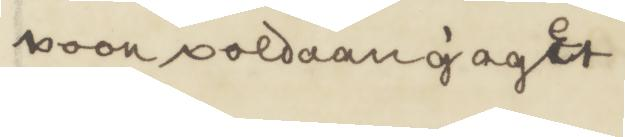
voor voldaan g’aght
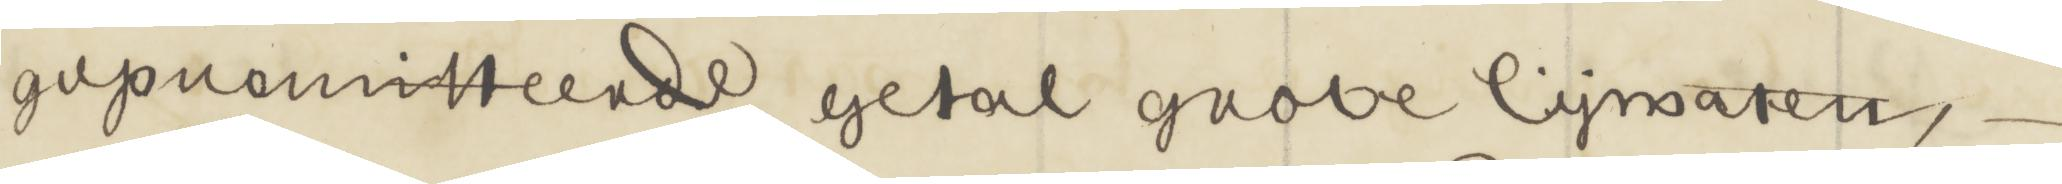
gepromitteerde getal grove lijwaten,
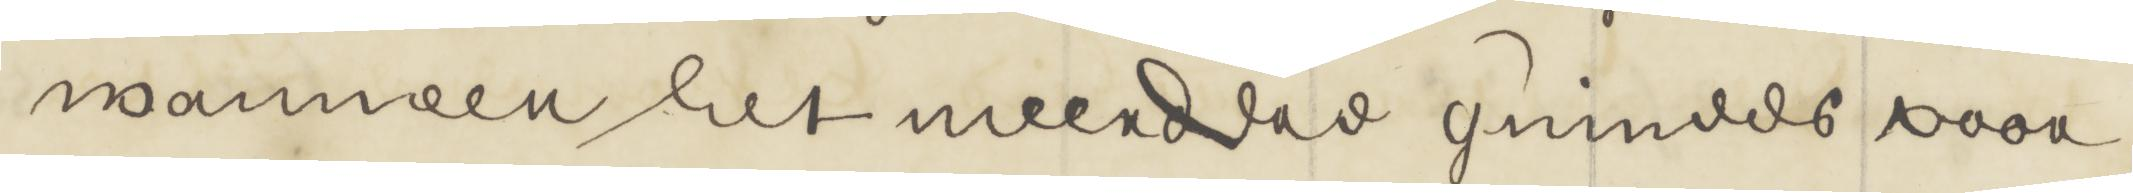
wanneer het meerdere guinees voor
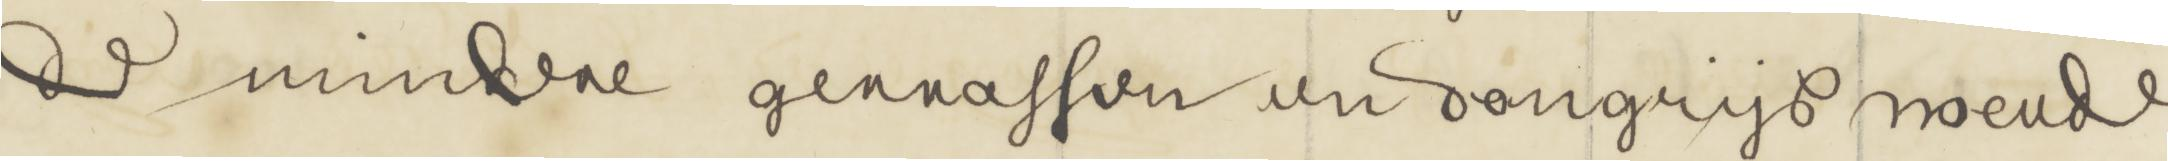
de mindere gerrassen en dongrijs werde
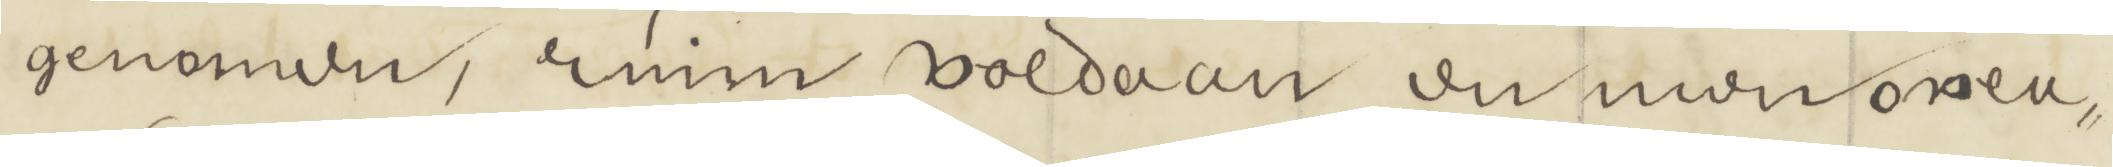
genomen, ruim voldaan en men over„
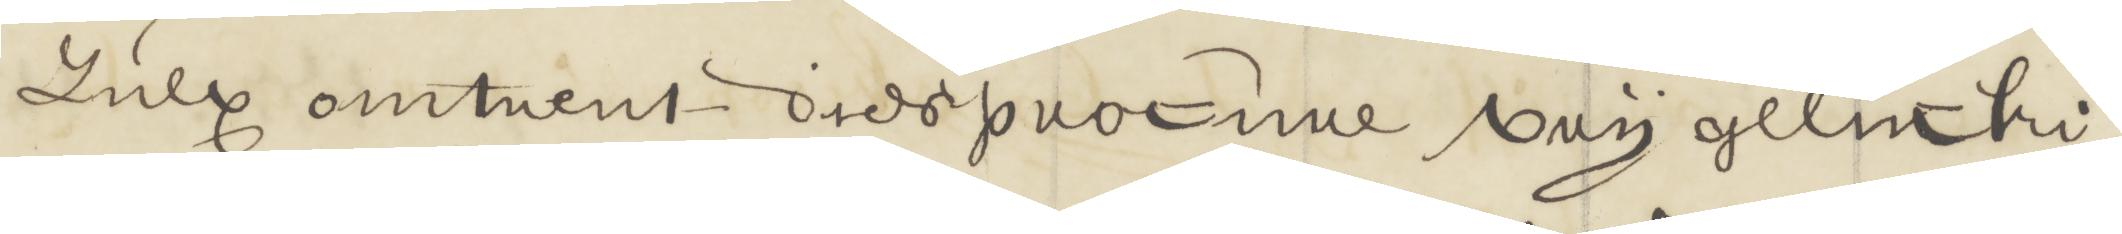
zulx omtrent dies procure vrij gelucki
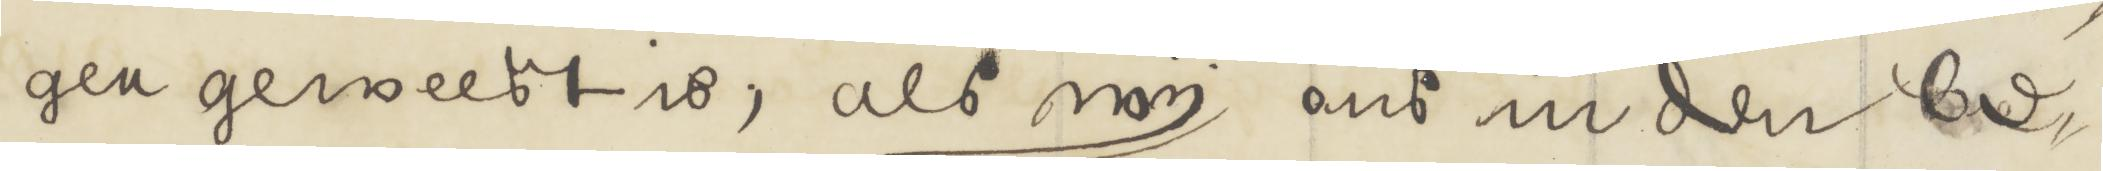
ger geweest is; als wij ons in den be„
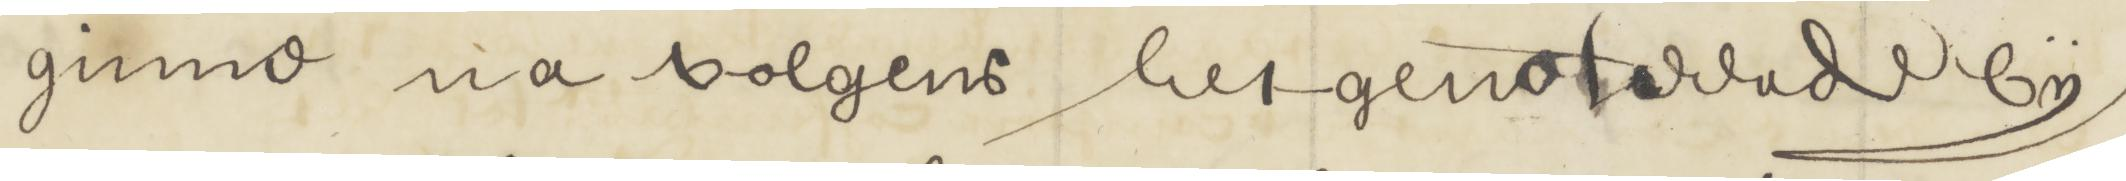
ginne na volgens het genoteerde bij
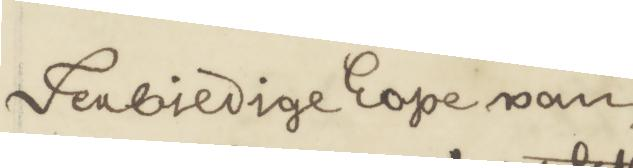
Eerbiedige hope van
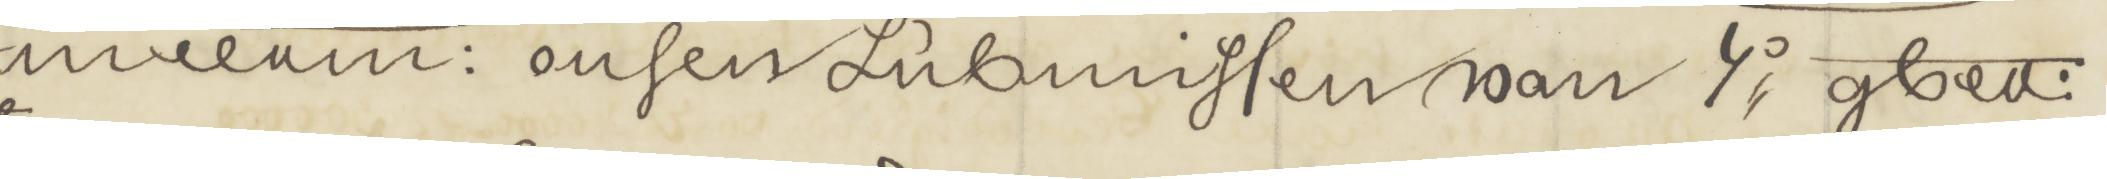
meerm: onsen submissen van 7„' 9ber:
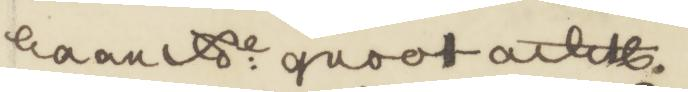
haar Ed:e groot achtb.
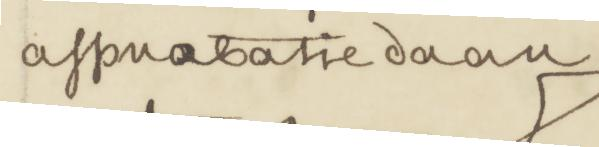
approbatie daar
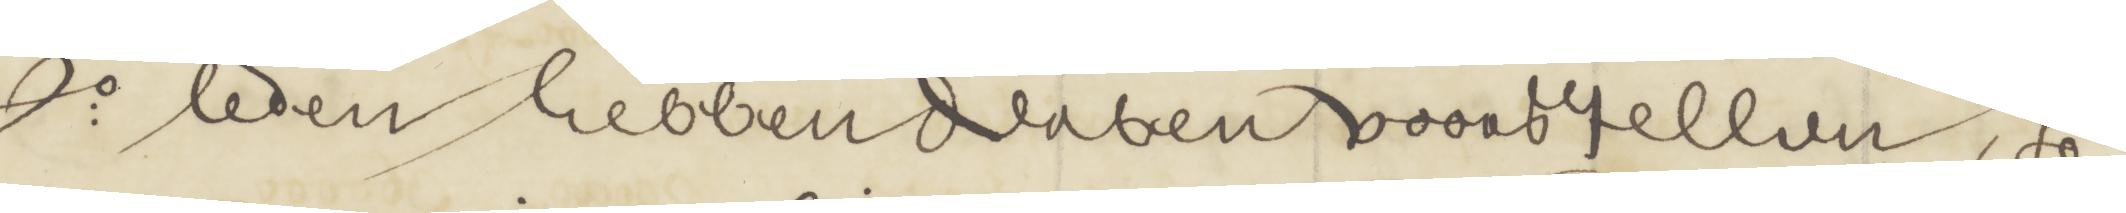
J:o leden hebben derven voorstellen, so
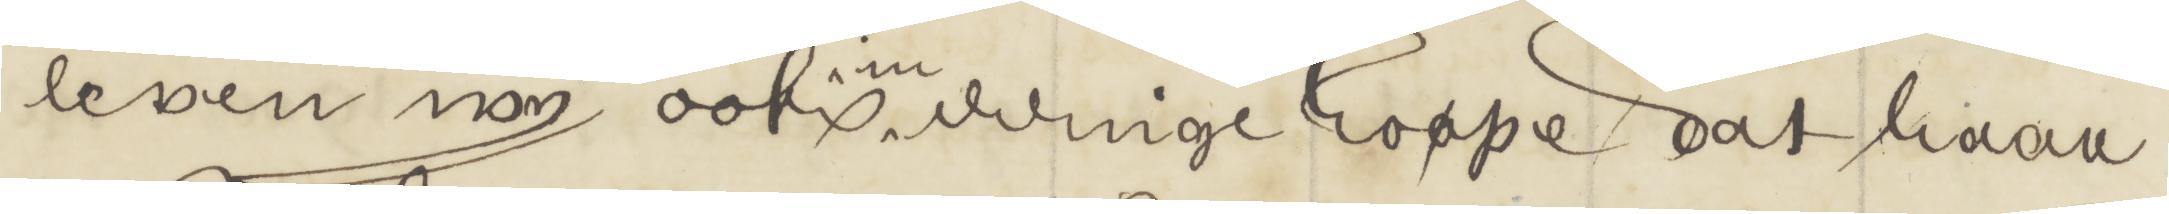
leven wij ook ^ eenige hoope dat haar
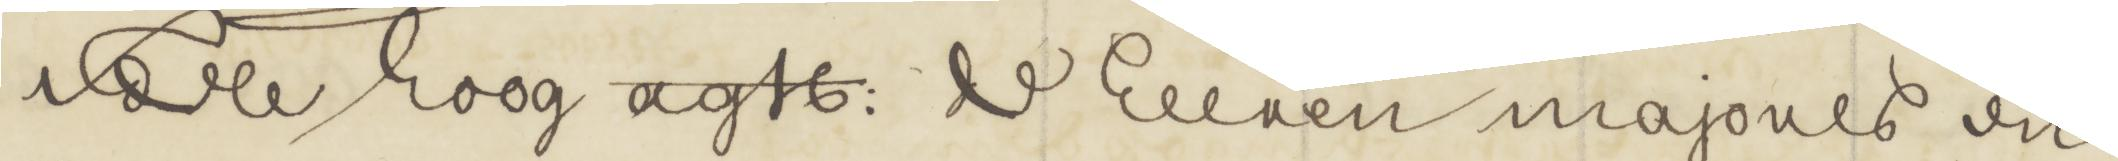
Edele hoog agtb: de heeren majores en
